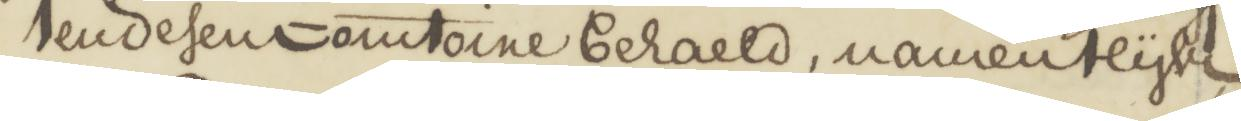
ten desen comtoire behaeld, namentlijk
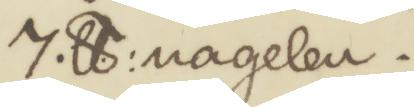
7. lb: nagelen
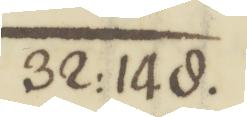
32:14.8.
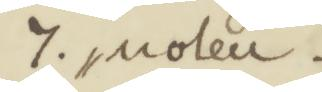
7. „ noten.
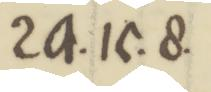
24.15.8.
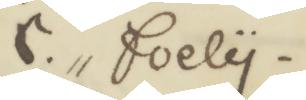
5. „ foelij
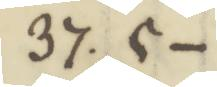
37. 5 –
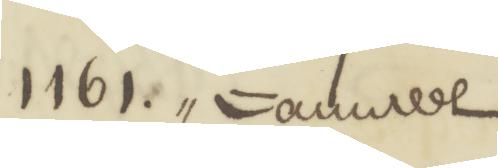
1161. „ canneel
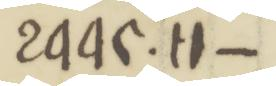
2445.11 –
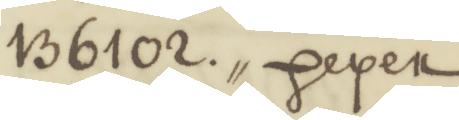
136102. „ peper
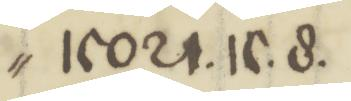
„ 15021.15.8.
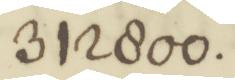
312800
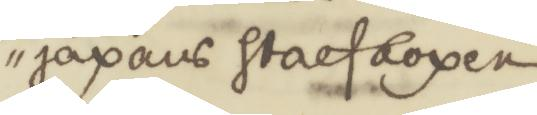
„ japans staefkoper
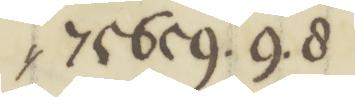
„ 75659:9.8
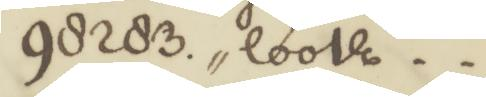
98283. „ looth - -
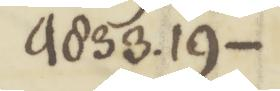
4833.19 –
